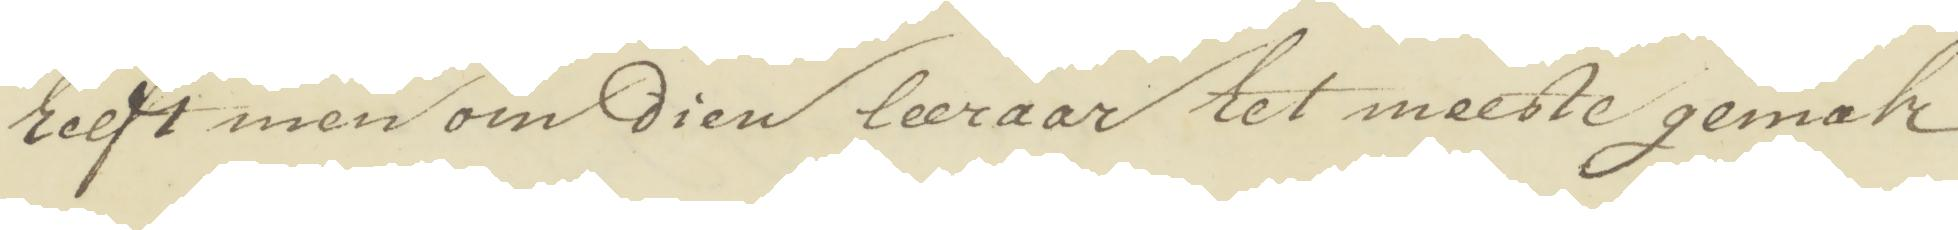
heeft men om dien leeraar het meeste gemak
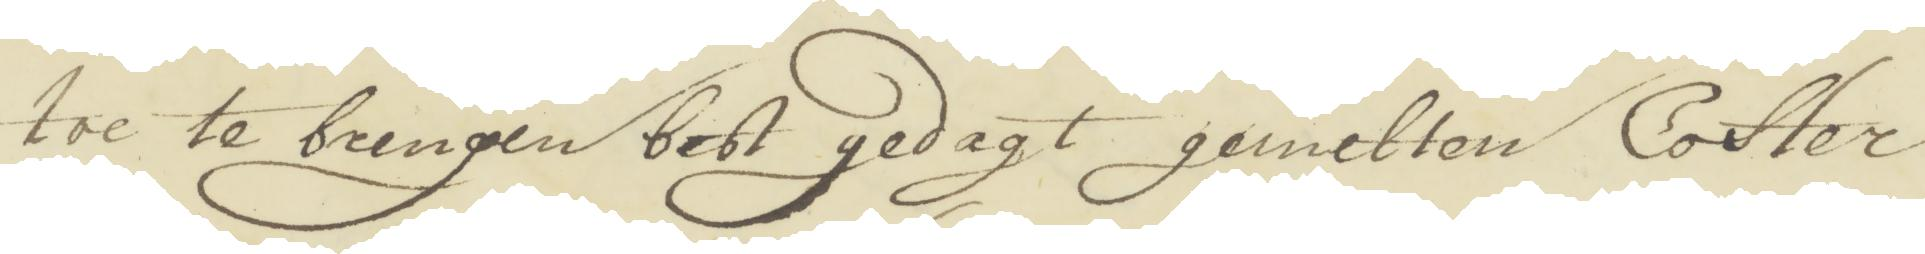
toe te brengen best gedagt gemelten Coster
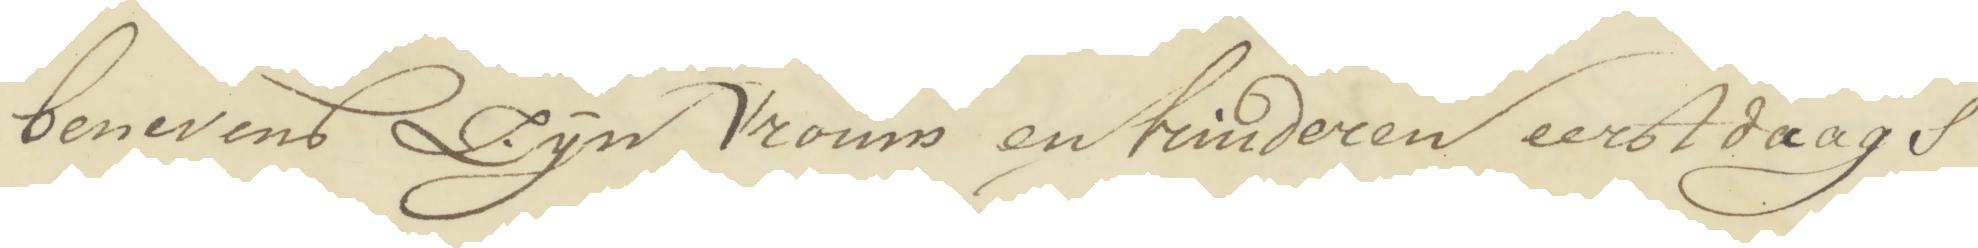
benevens zijn vrouw en kinderen eerstdaags
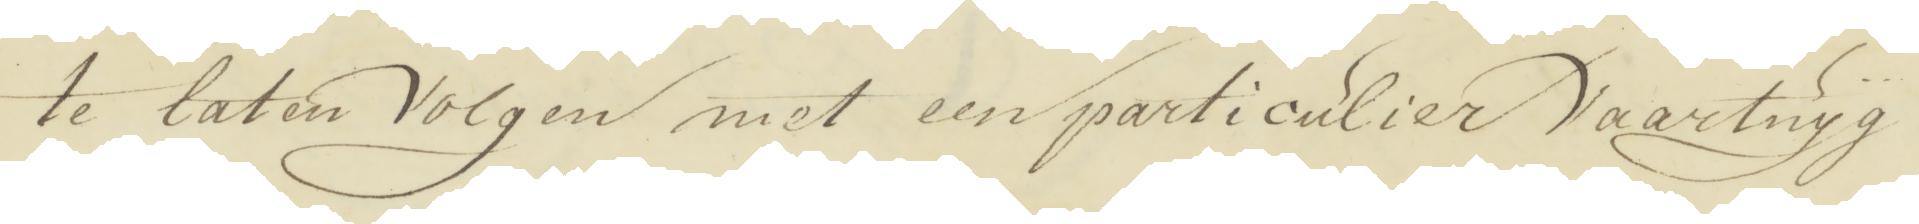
te laten volgen met een particulier vaartuijg
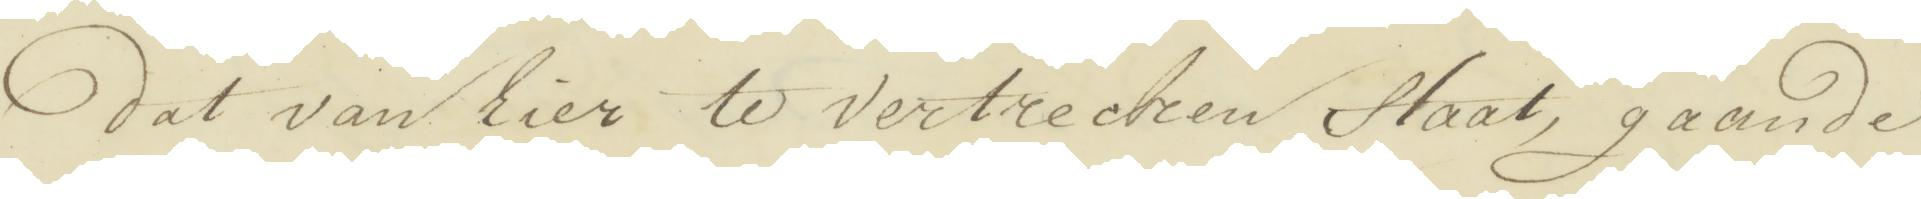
dat van hier te vertrecken staat, gaande
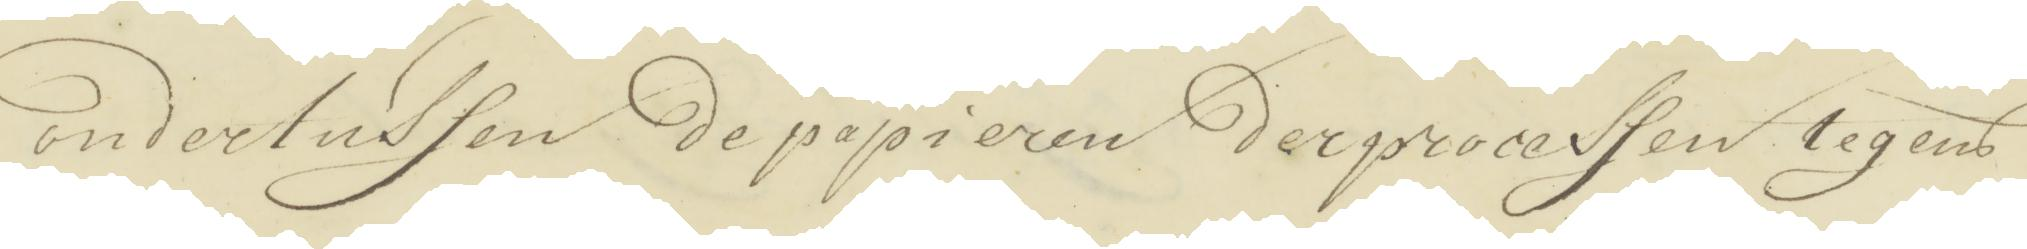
ondertussen de papieren der processen tegens
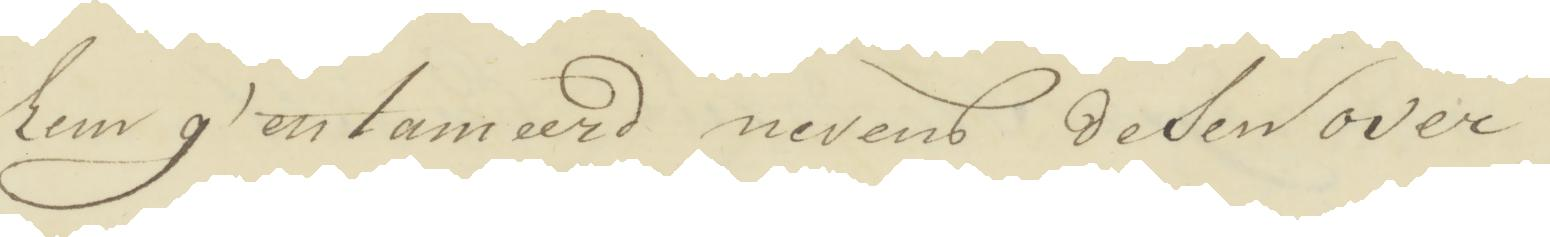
hem g’entameerd nevens desen over
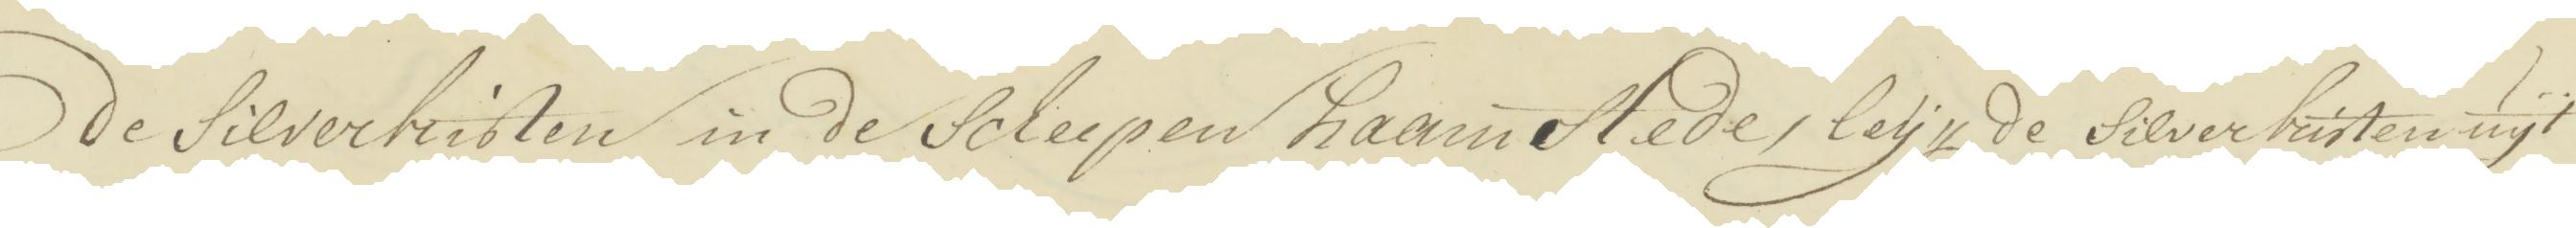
de silverkisten in de scheepen haamstede, leij„ de silverkisten uijt
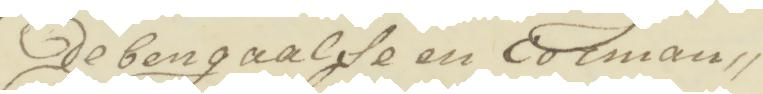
de bengaalse en Corman„
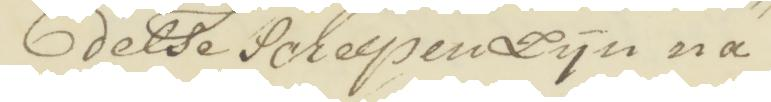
delse scheepen zijn na
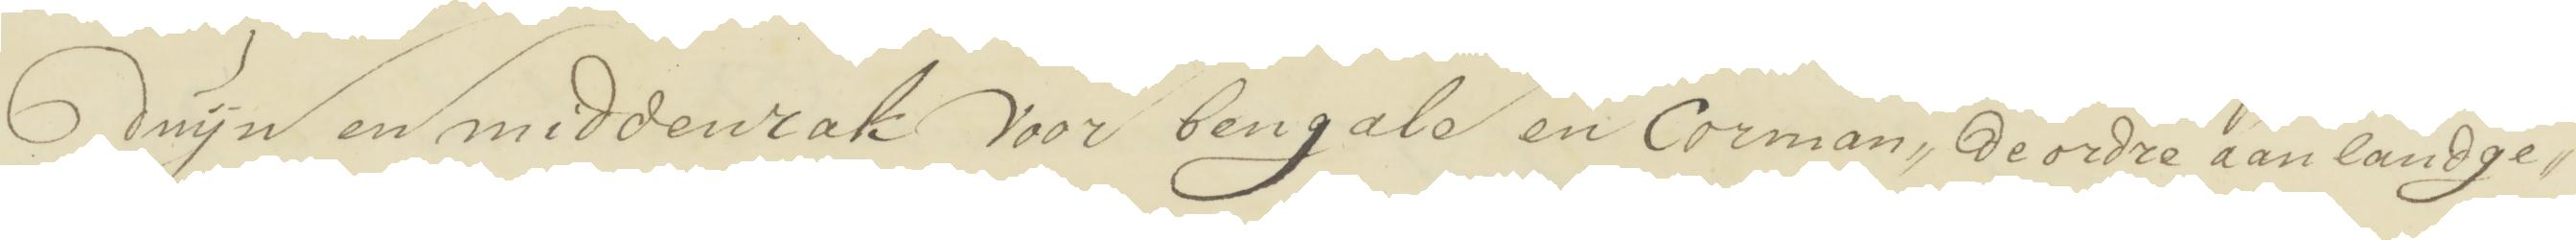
duijn en middenrak voor bengale en Corman„ de ordre aan land ge„
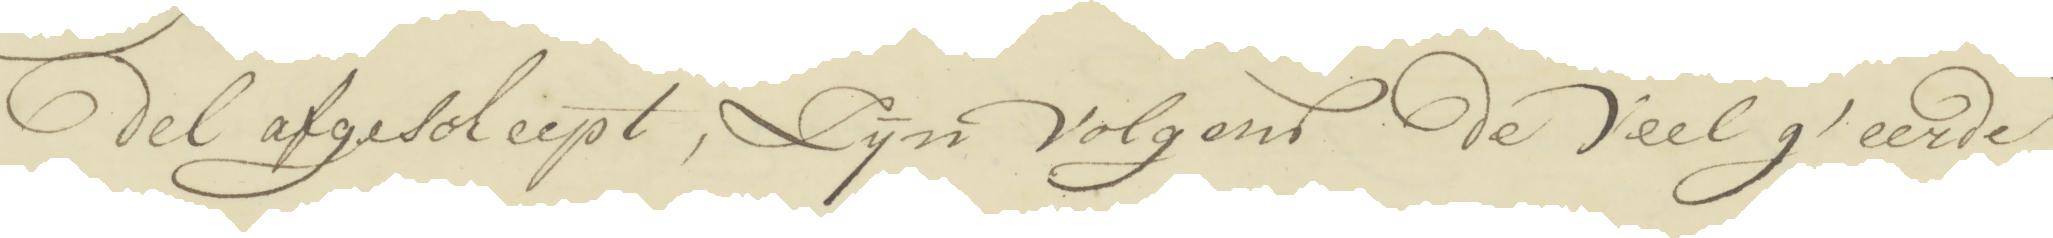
del afgescheept, zijn volgens de veel g’eerde
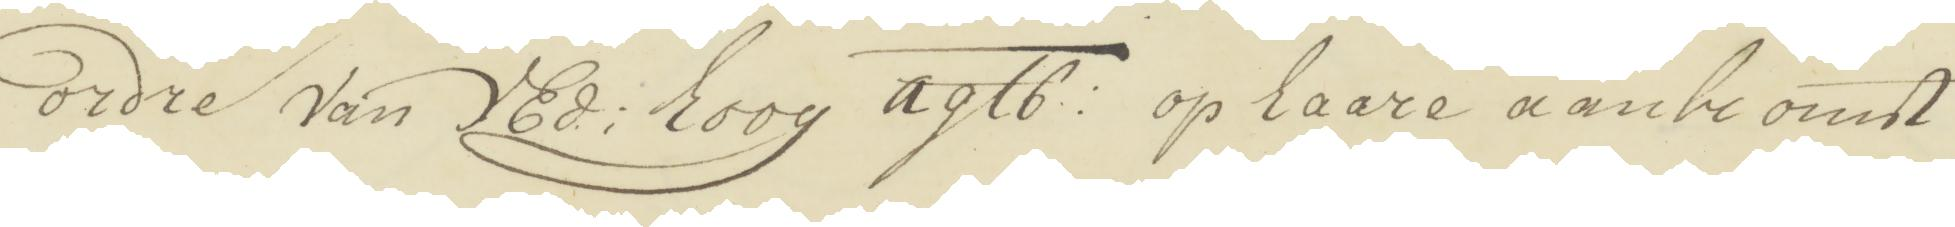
ordre van VEd: hoog agtb: op haare aankomst
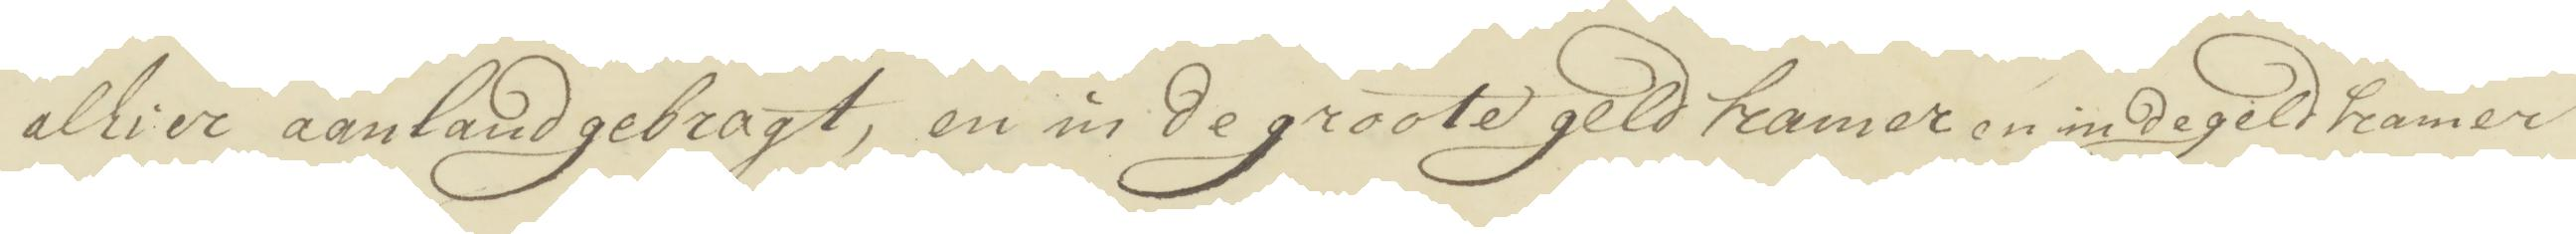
alhier aan land gebragt, en in de groote geld kamer en in de geld kamer
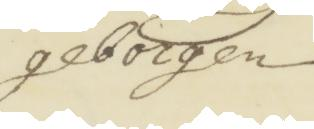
geborgen
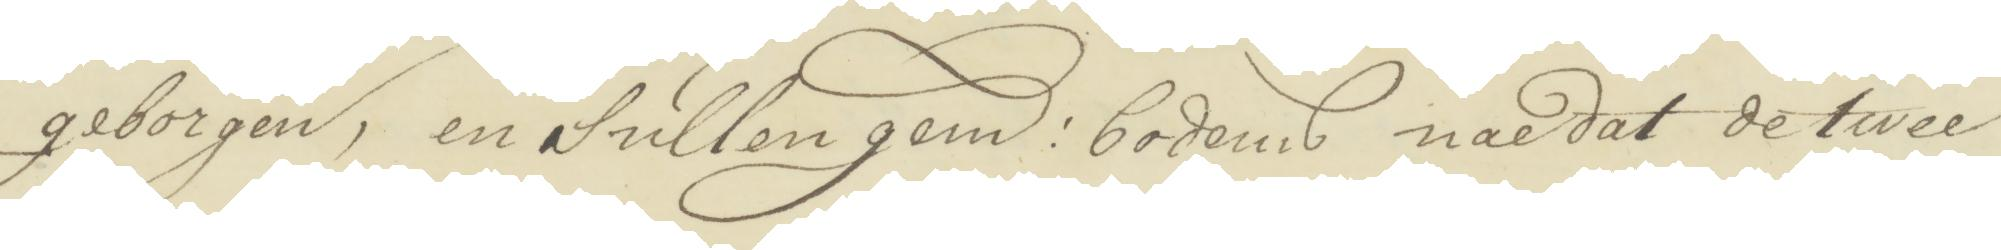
geborgen, en sullen gem: bodems nae dat de twee
